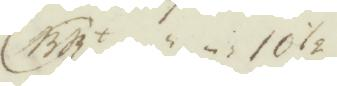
13 pCt . . „ - „ 10½
